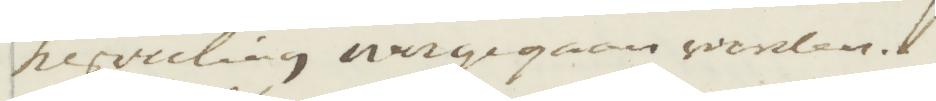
herveiling overgegaan worden.
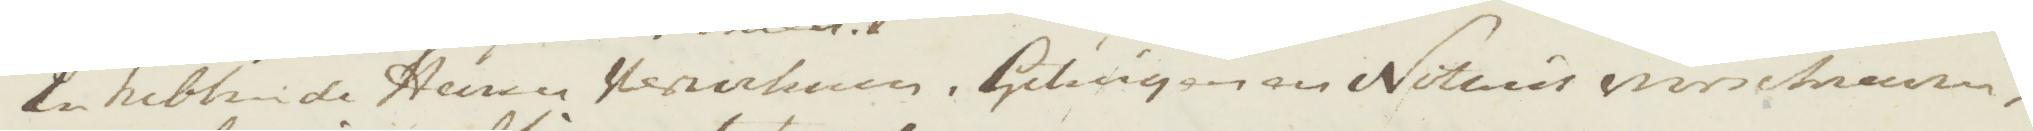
En hebbende Heeren Verzochten, Getuigen en Notaris voorschreeven,
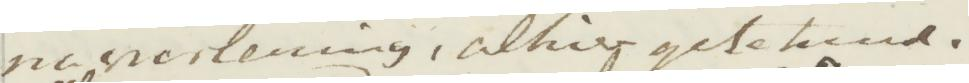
na voorlezing, alhier geschend.
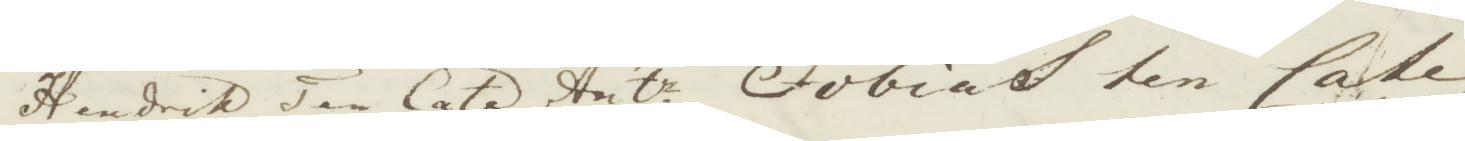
Hendrik Ten Cate Antz Tobias ten Cate
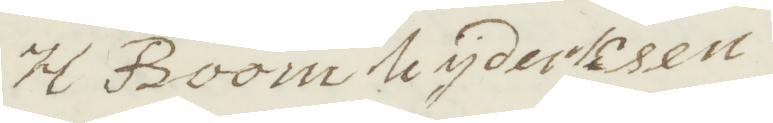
H Boom h ij derksen
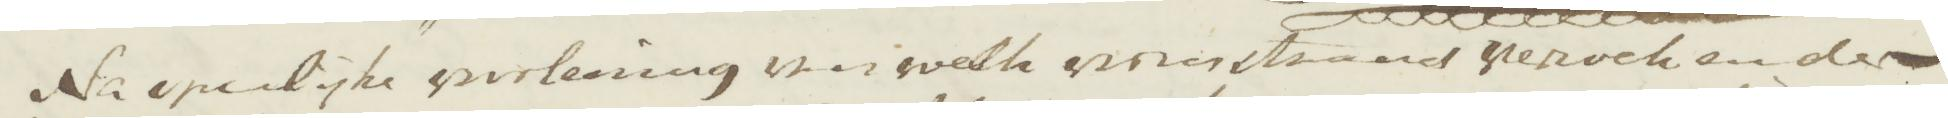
Na openlijke voorlezing over welk voorstaand verzoek en der
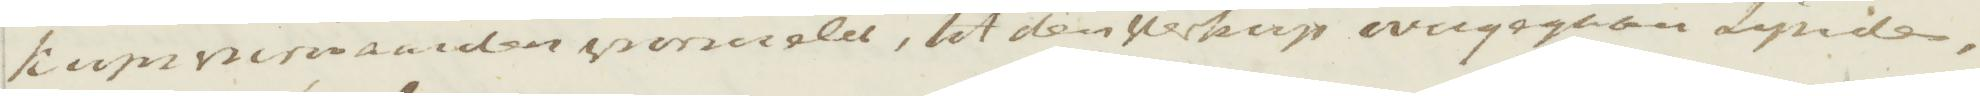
Koopervoorwaarden voormeld, tot den verkoop overgegaan zijnde,
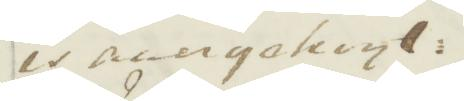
is aangekogt:
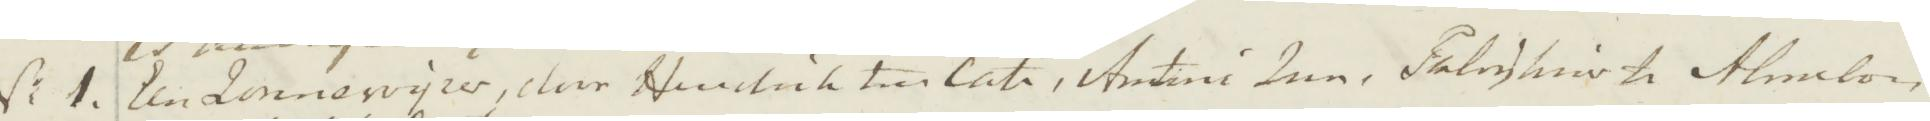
N:o 1. Een Zonnewijzer, door Hendrik ten Cate, Antoni Zoon, Falnyhuis Almelo,
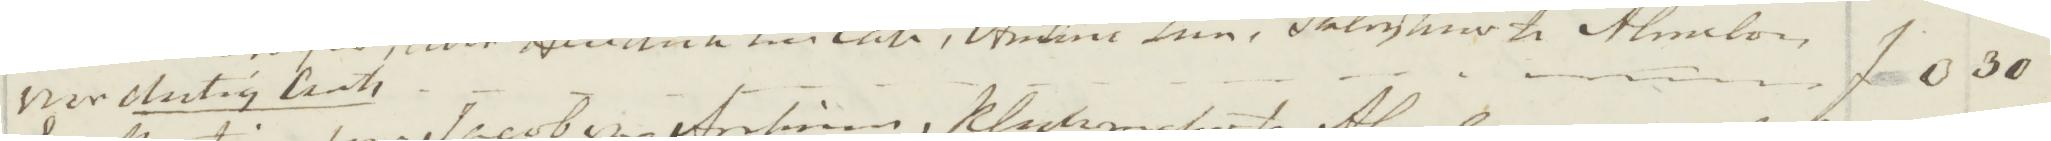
vier dertig Cents .- - - - - - - - - - - - - - - - - - - - - - - - - - ƒ0 30
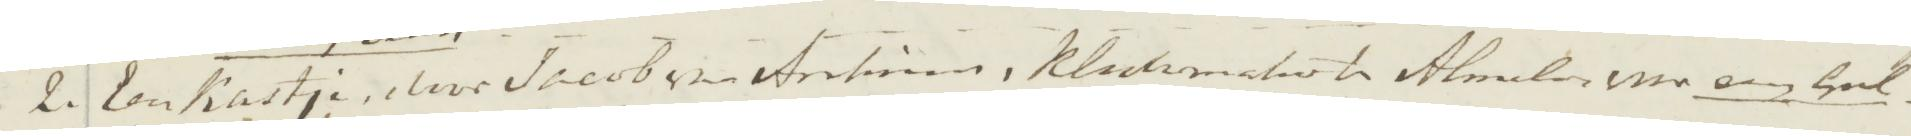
2. Een kastje, door Jacob van Antinus, Kledermaker te Almelo van een Gul
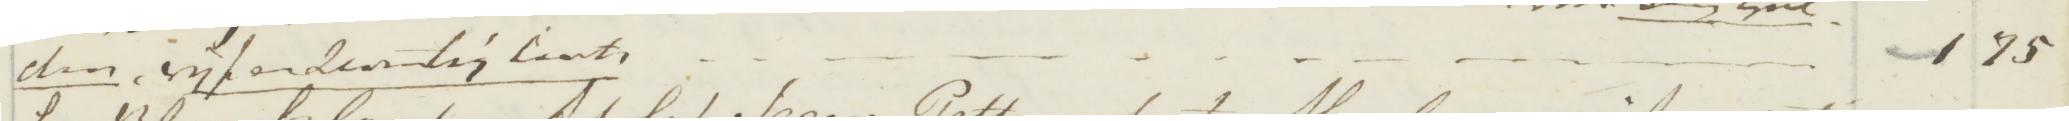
den vijf en Zeventig Cents - - - - - - - - - - - - - - - - - - - - - 1 75
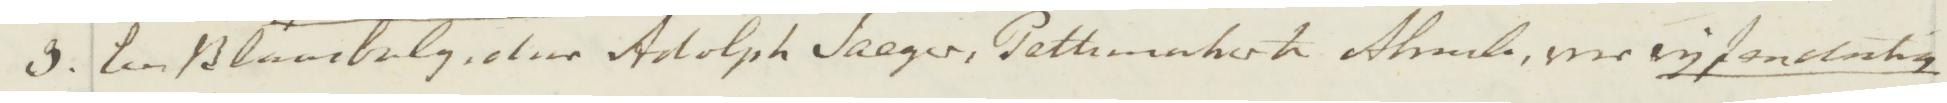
3: Een Blaasbalg, dur Adolph Iaager, Pettenmaker te Almelo, voor vijf endertig
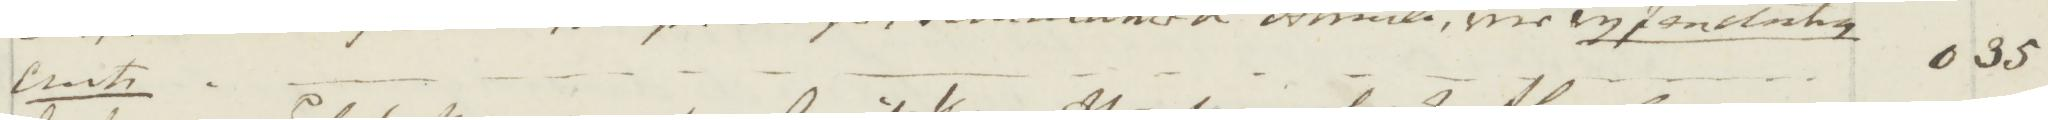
Cents - - - - - - - - - - - - - - - - - - - - - - - - - - - - 0 35
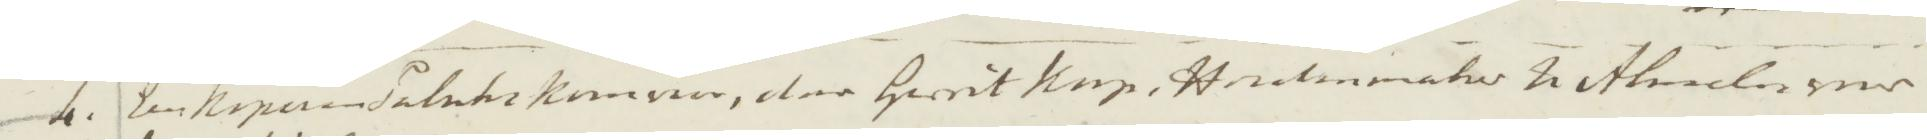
4. Een Koperen Talcts komvoor, daar Gerrit Koop, Hoedenmaker te Almelo voor
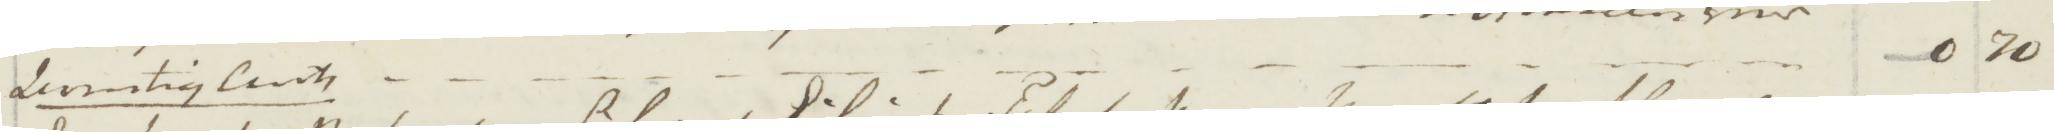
Zeventig Cents - - - - - - - - - - - - - - - - - - - -- — 0 70
